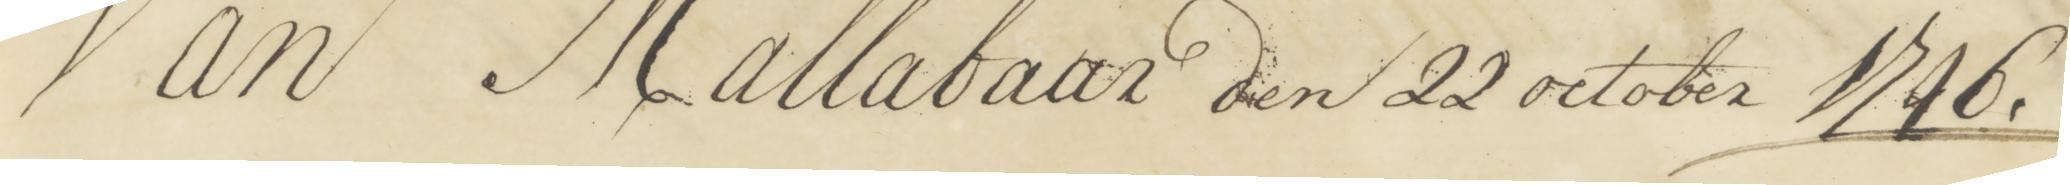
Van Mallabaar den 22 october 1746.
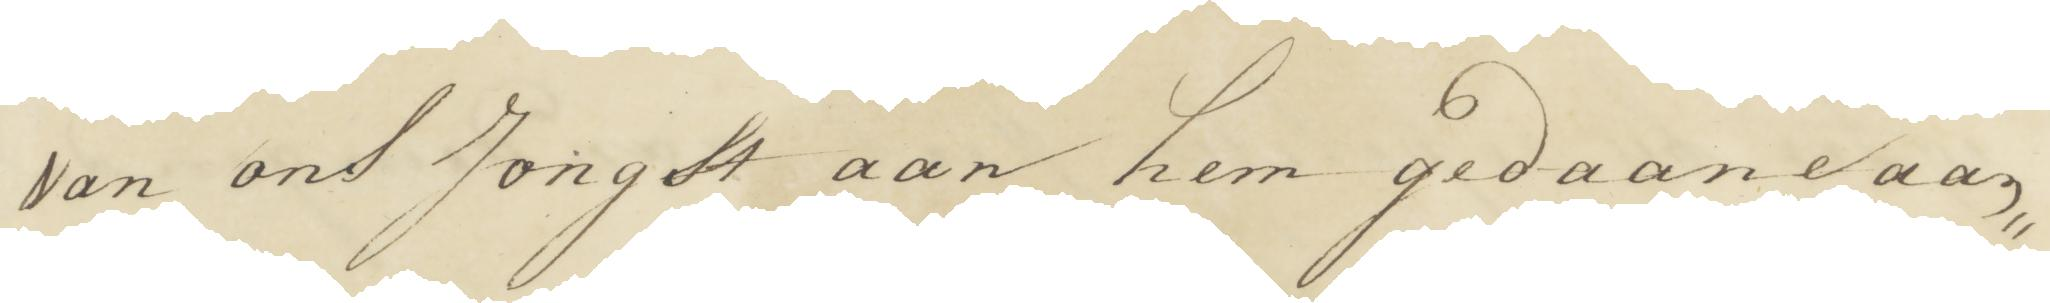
van ons Jongst aan hem gedaane aan„
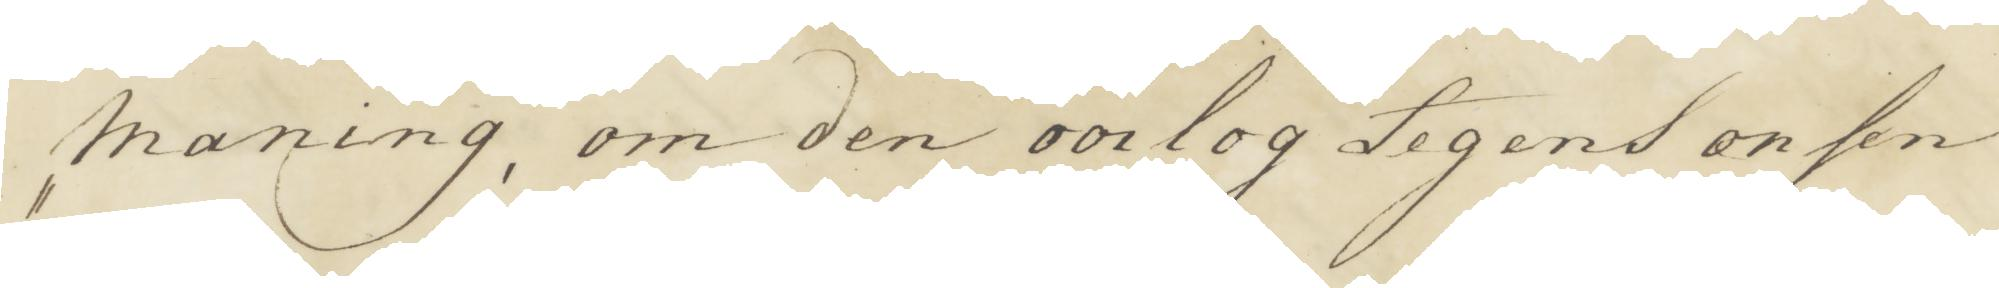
„maning, om den oorlog tegens onsen
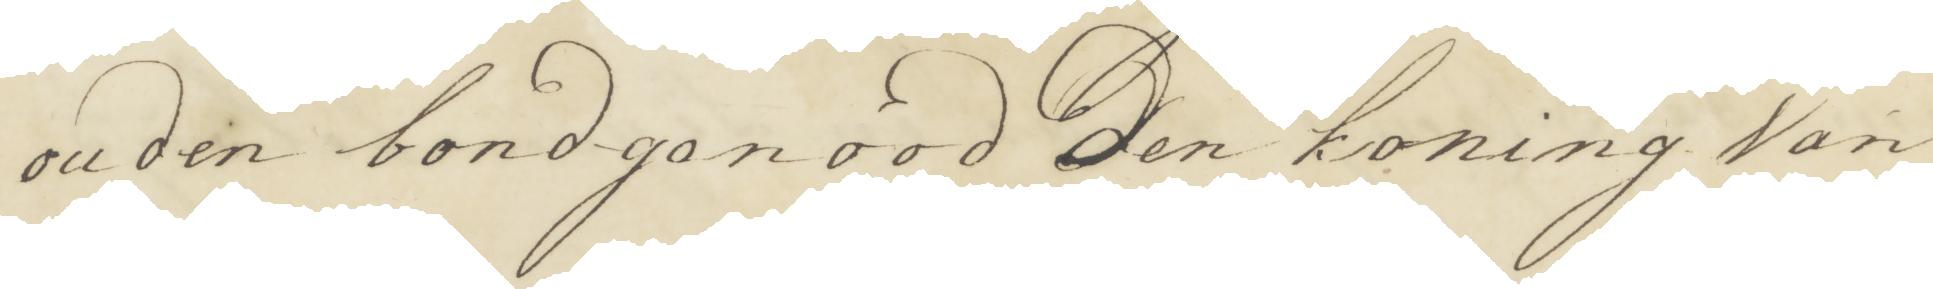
ouden bondgenood den koning van
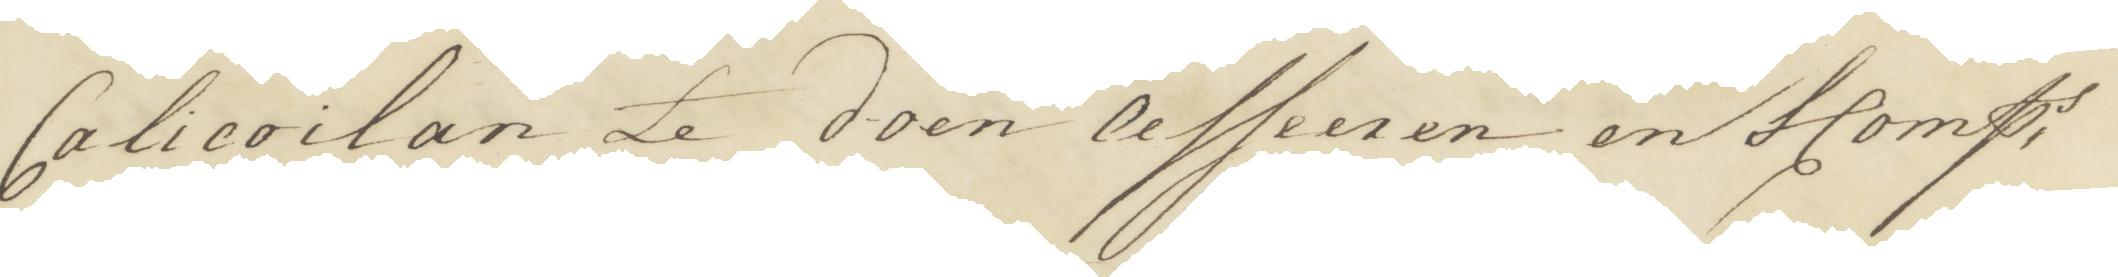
Calicoilan te doen cesseeren, en sComp„s
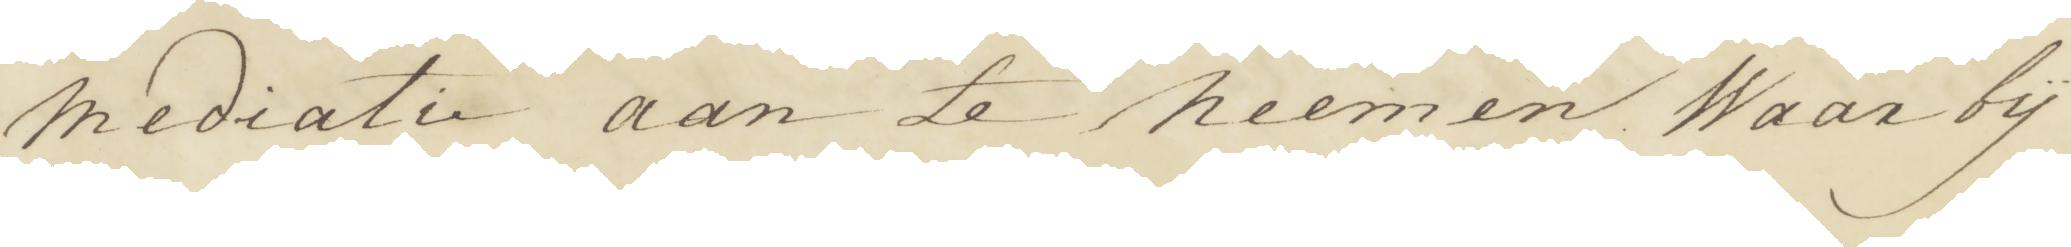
mediatie aan te neemen, waar bij
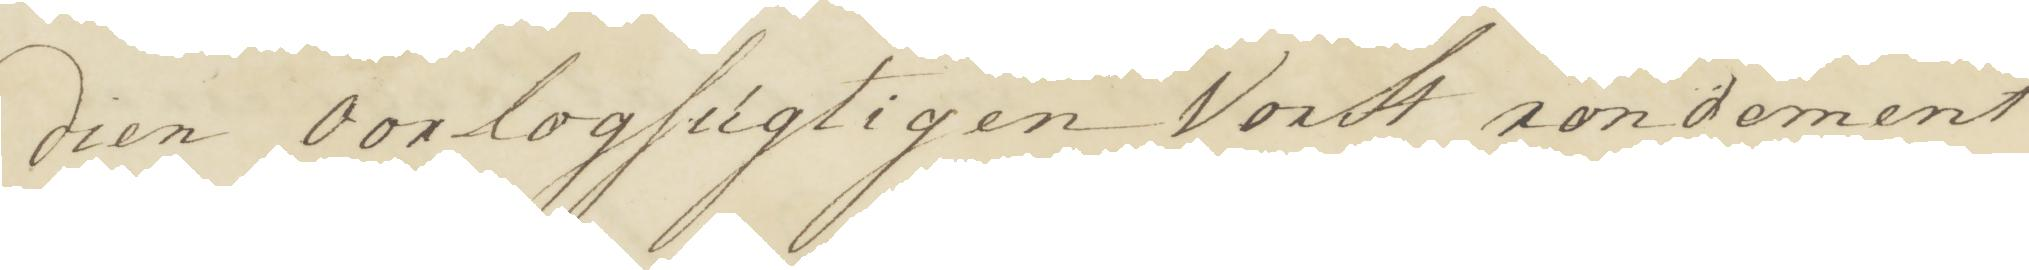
dien oorlogsugtigen Vorst rondement
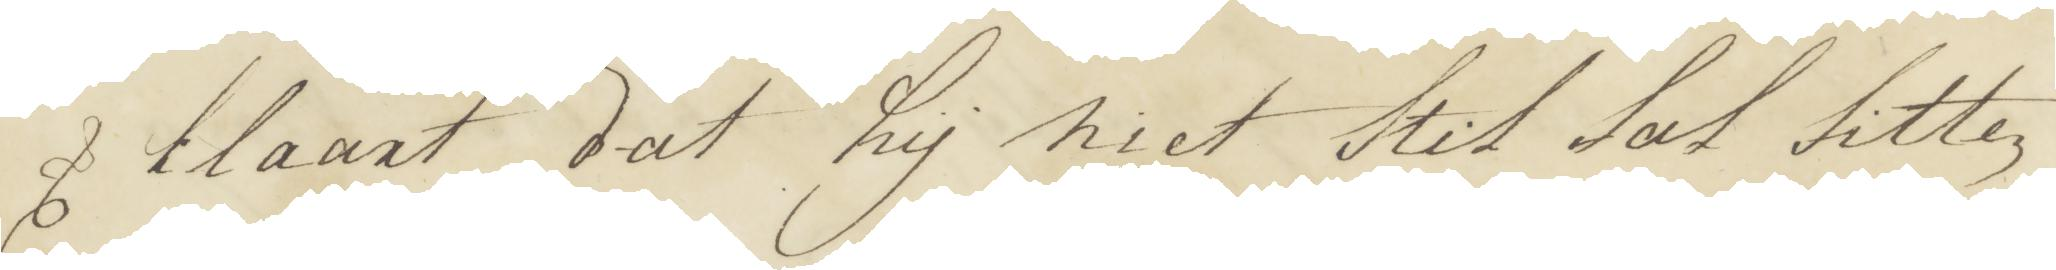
verklaart, dat hij niet stil sal sitten,
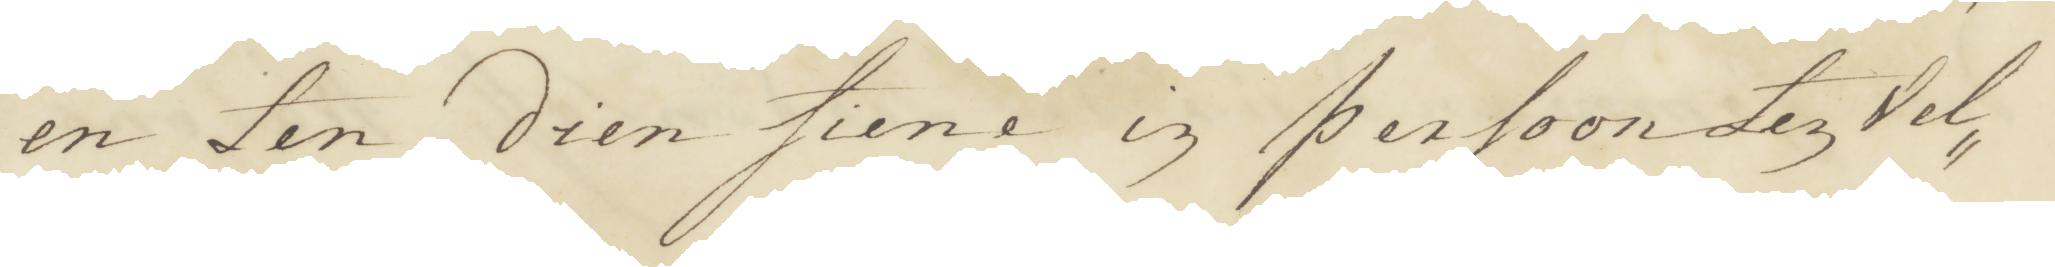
en ten dien siene in persoon ten vel„
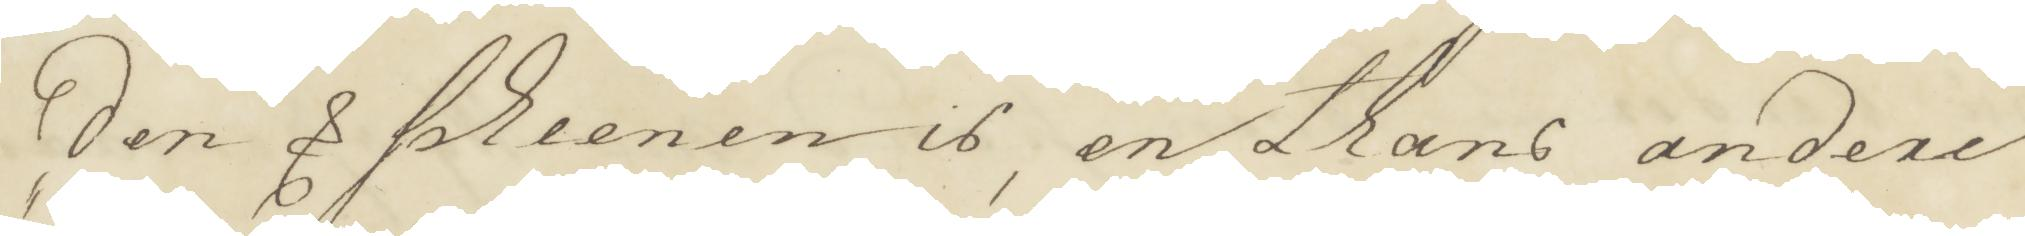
„den verscheenen is, en thans andere
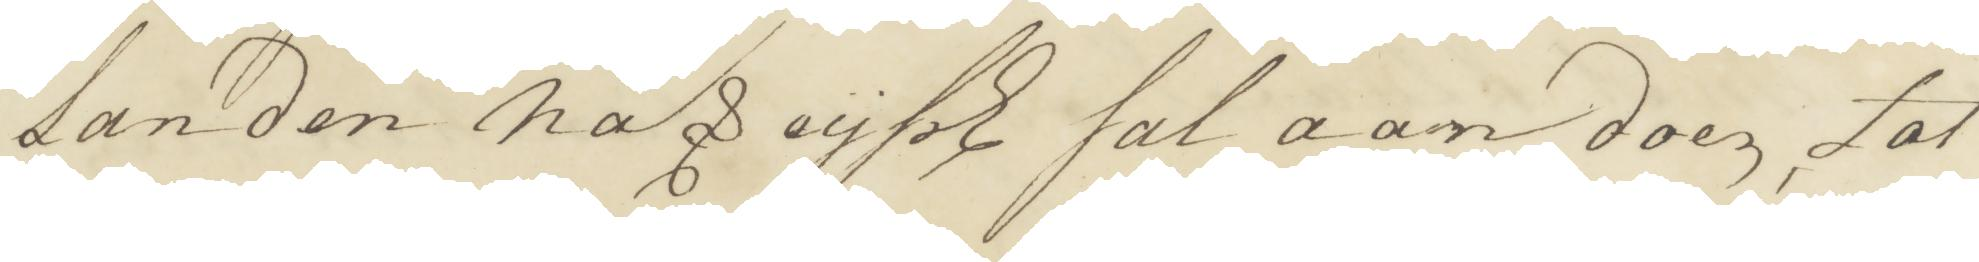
landen na vereijsch sal aan doen, tot
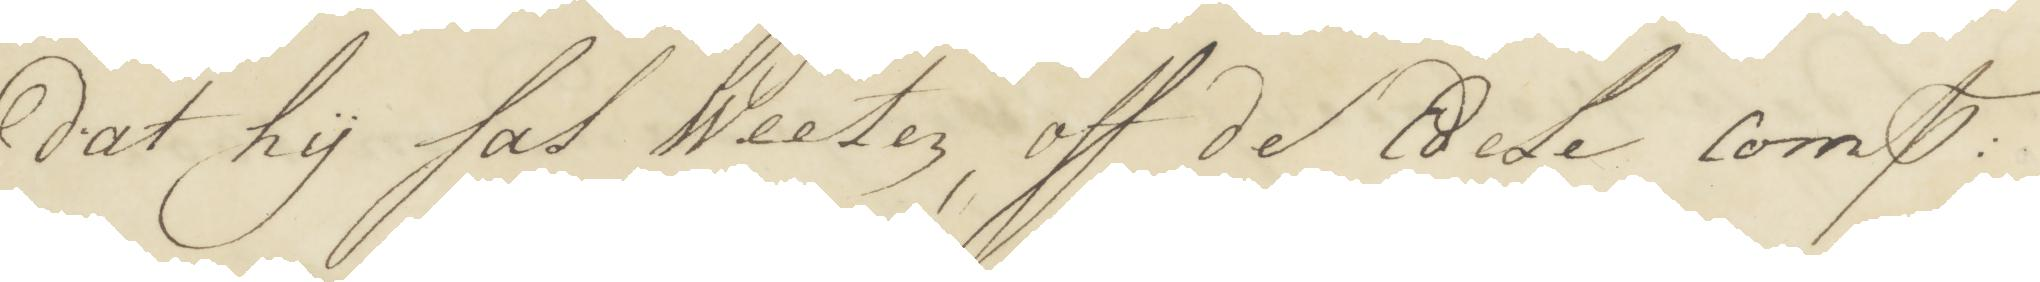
dat hij sal weeten, off de Edele comp:
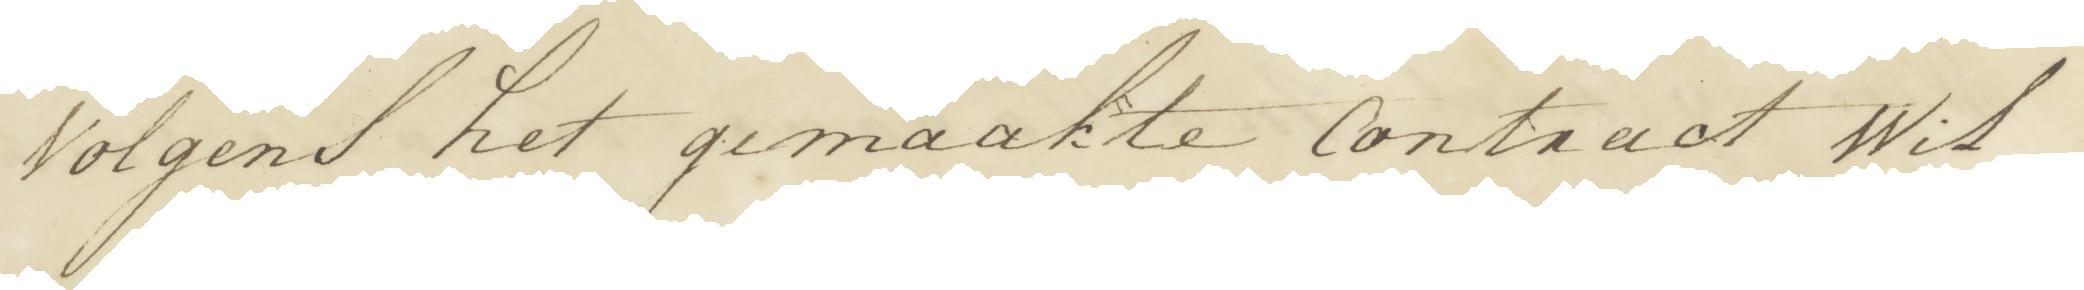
volgens het gemaakte contract wil
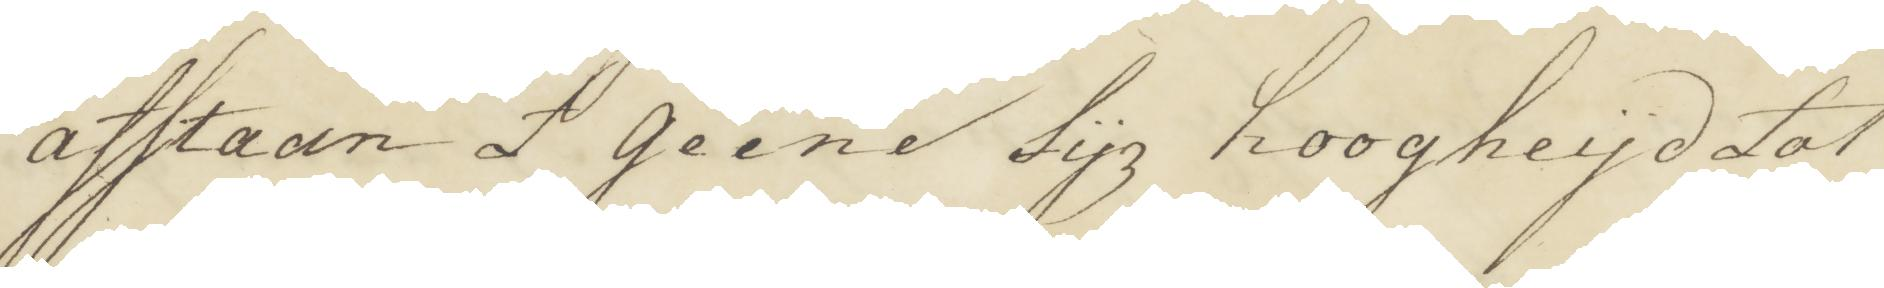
afstaan t geene sijn hoogheijd tot
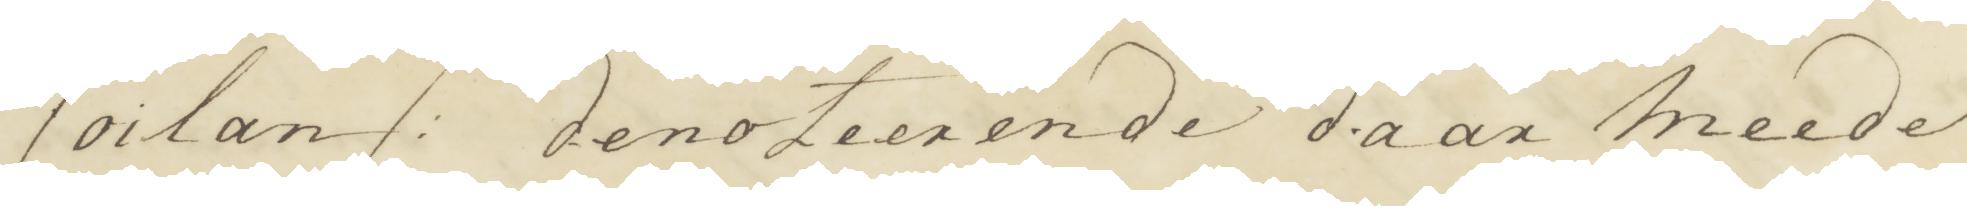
Coilan /: denoteerende daar meede
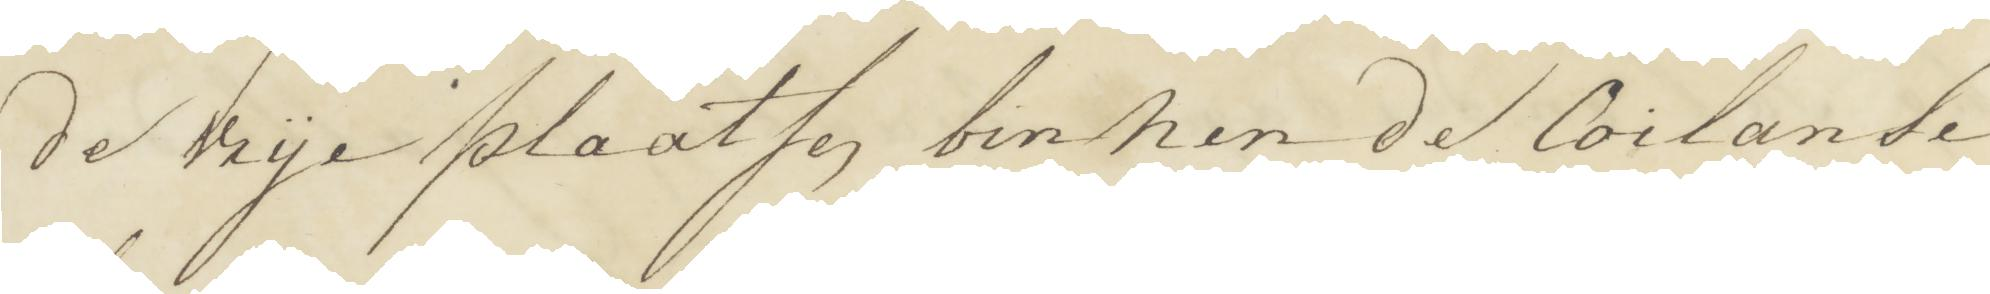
de vrije plaatsen binnen de Coilanse
